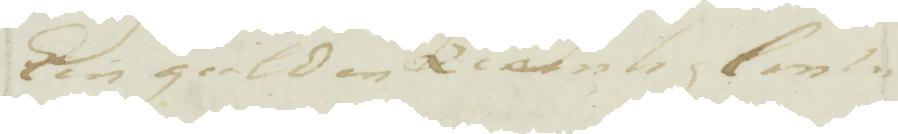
Een gulden zeventig Cents
